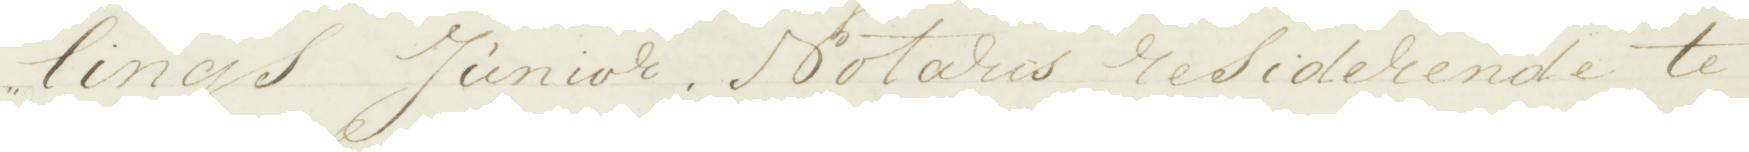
„lings Junior, Notaris residerende te
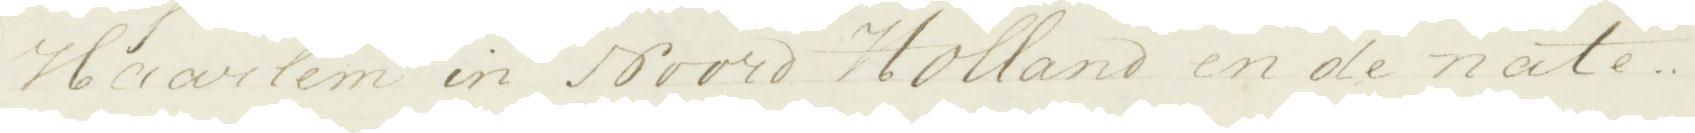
Haarlem in Noord Holland en de nate„
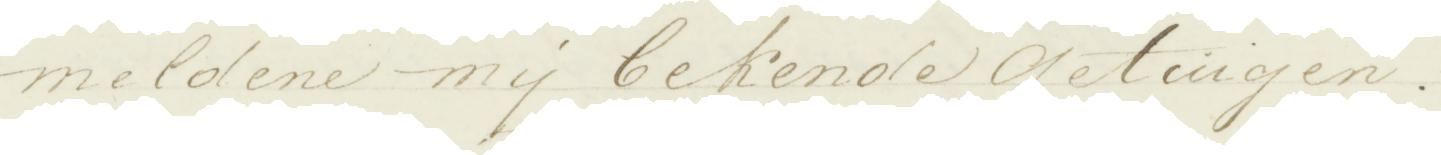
meldene mij bekende Getuigen.
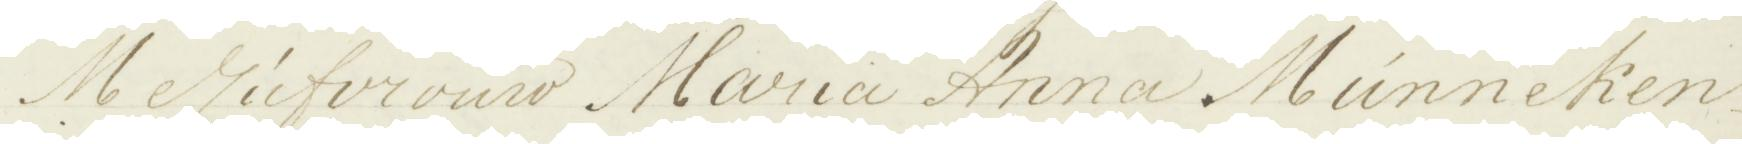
Mejufvrouw Maria Anna Munneken
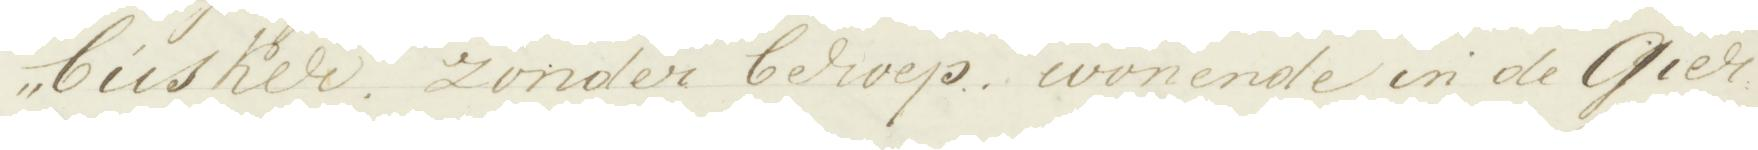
„busker, zonder beroep, wonende in de Gier„
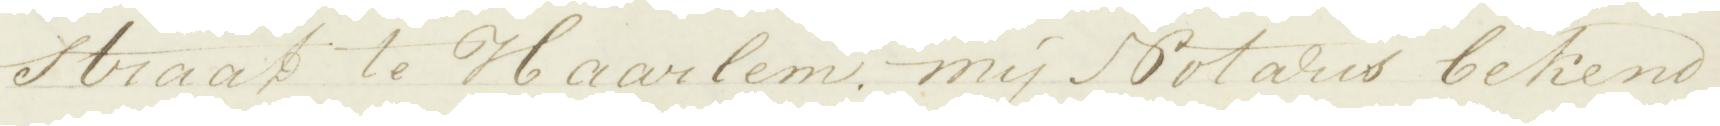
straat te Haarlem, mij Notaris bekend
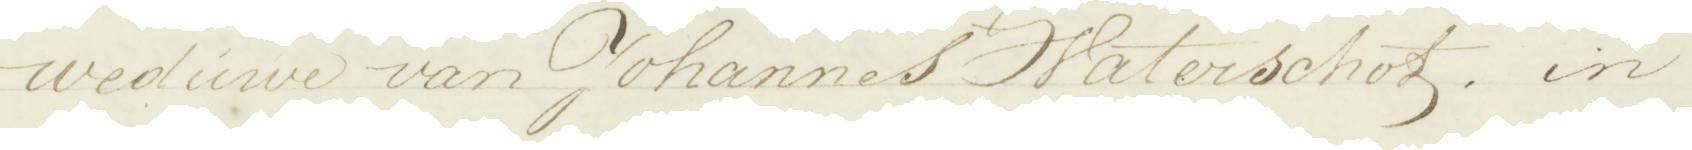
weduwe van Johannes Waterschot, in
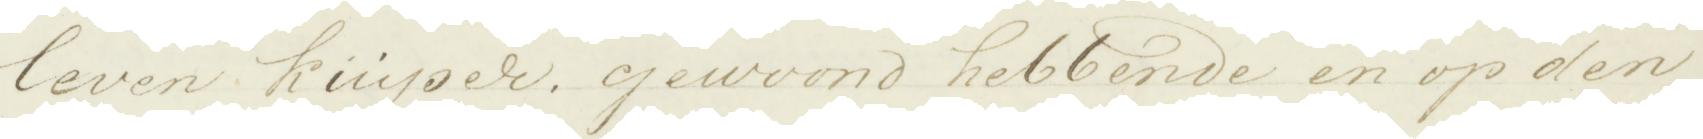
leven kuiper, gewoond hebbende en op den
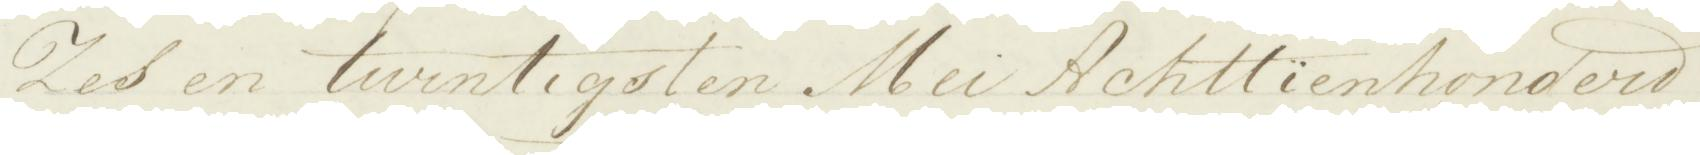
Zes en twintigsten Mei Achttienhonderd
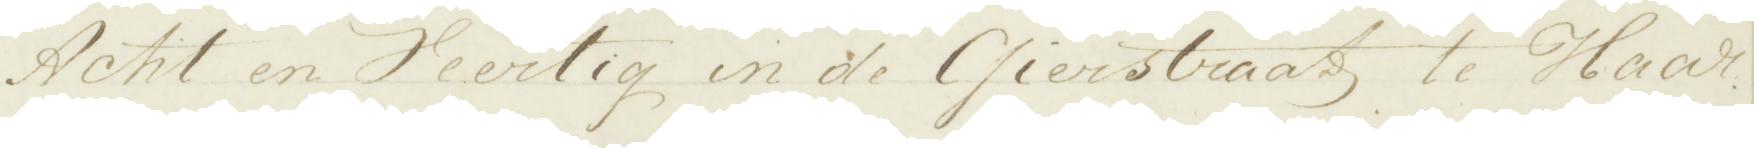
Acht en Veertig in de Gierstraat te Haar„
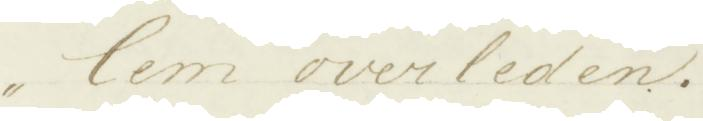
„lem overleden.
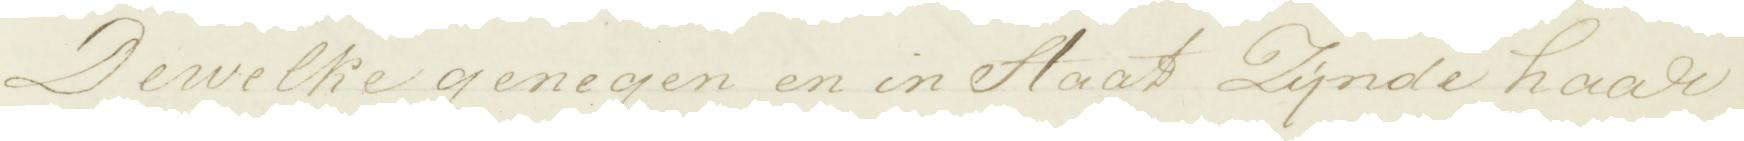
Dewelke genegen en in staat zijnde haar
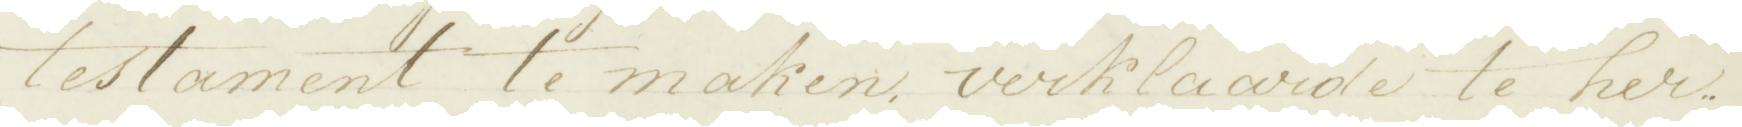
testament te maken, verklaarde te her„
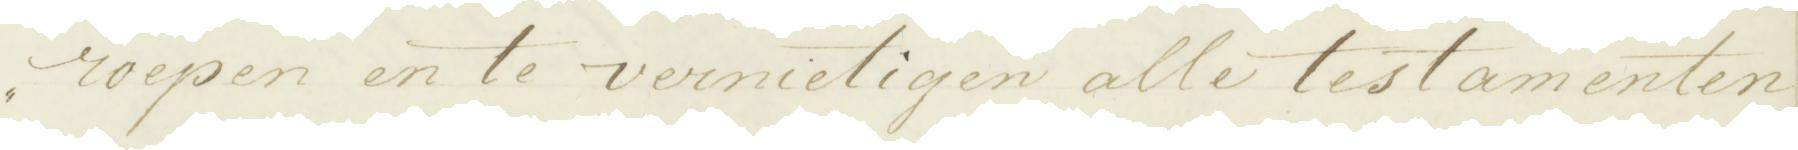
„roepen en te vernietigen alle testamenten
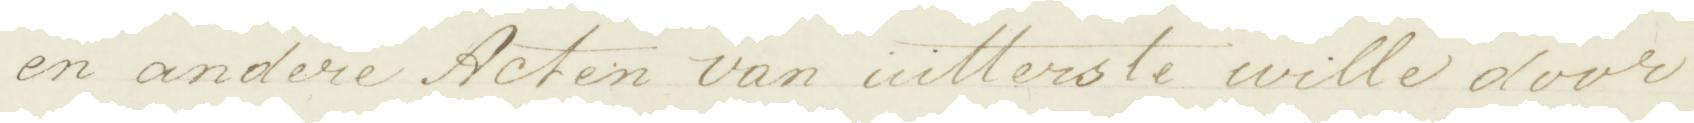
en andere Acten van uitterste wille door
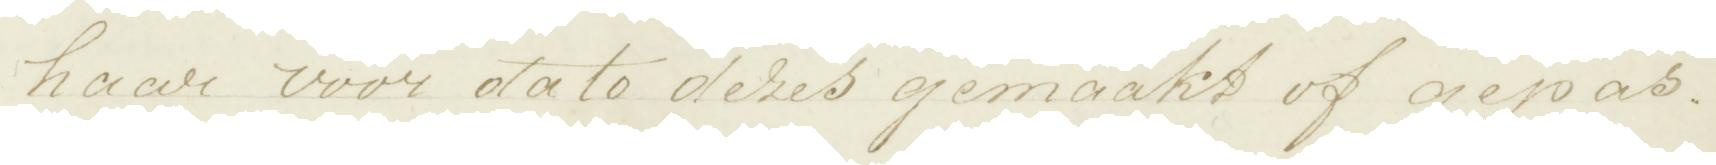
haar voor dato dezes gemaakt of gepas„
